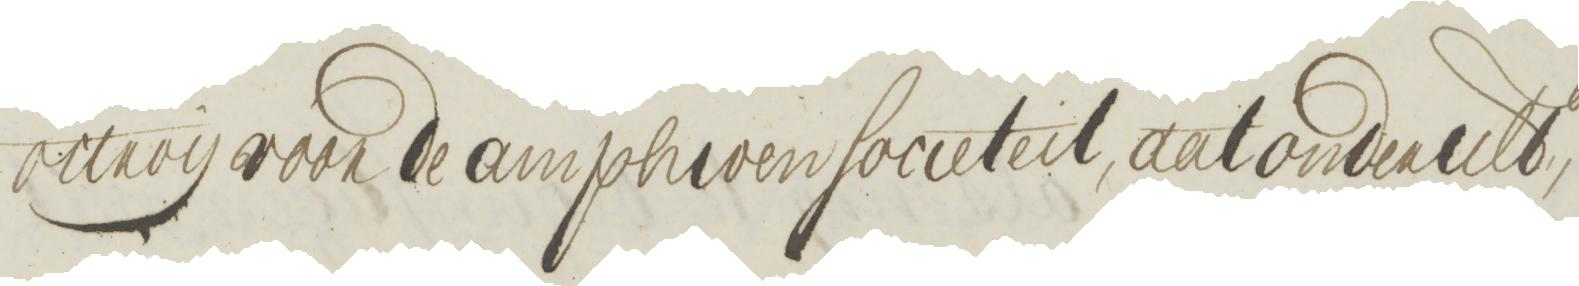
octroij voor de amphioen societeit, dat onder ult„o
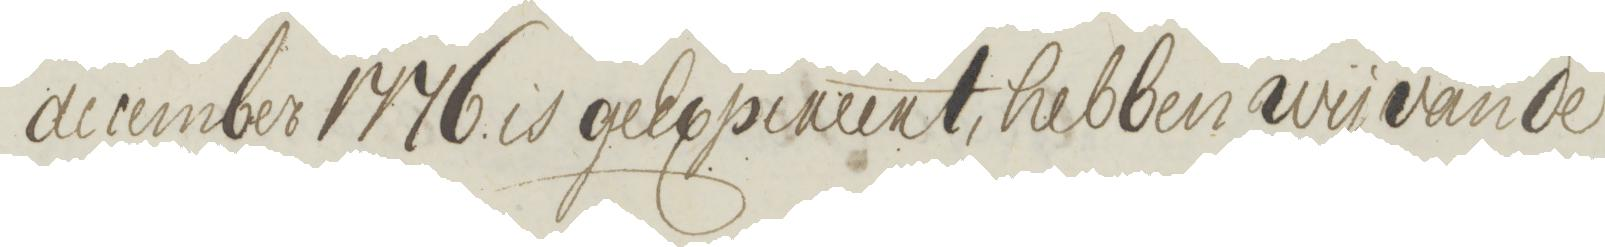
december 1776. is geExpireert, hebben wij van de
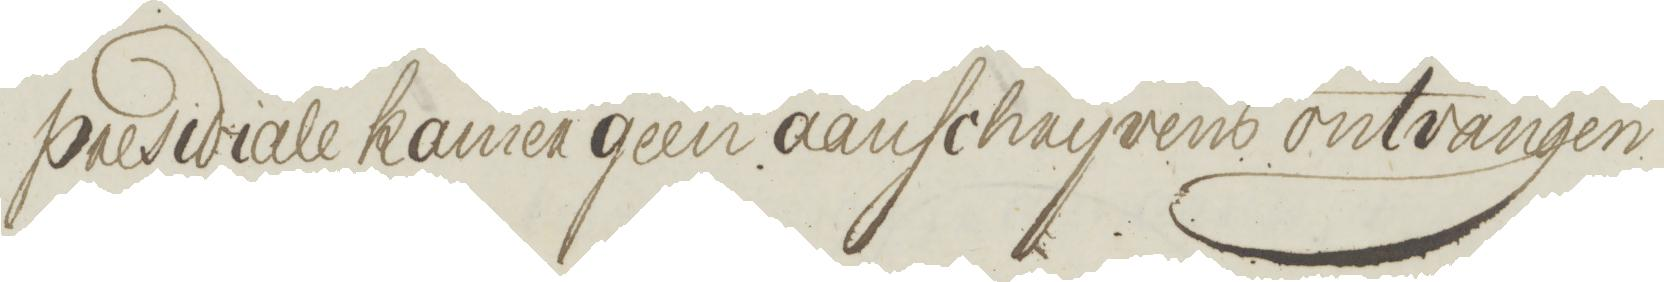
presidiale kamer geen aanschrijvens ontvangen
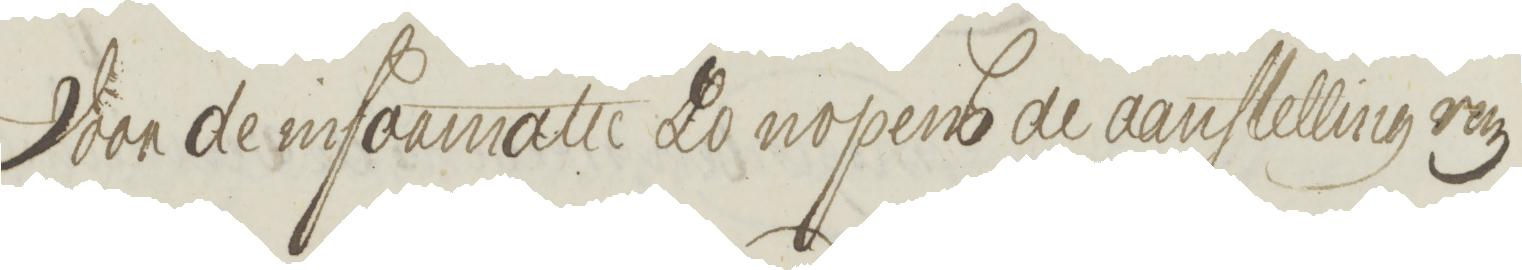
Voor de informatie zo nopens de aanstelling van
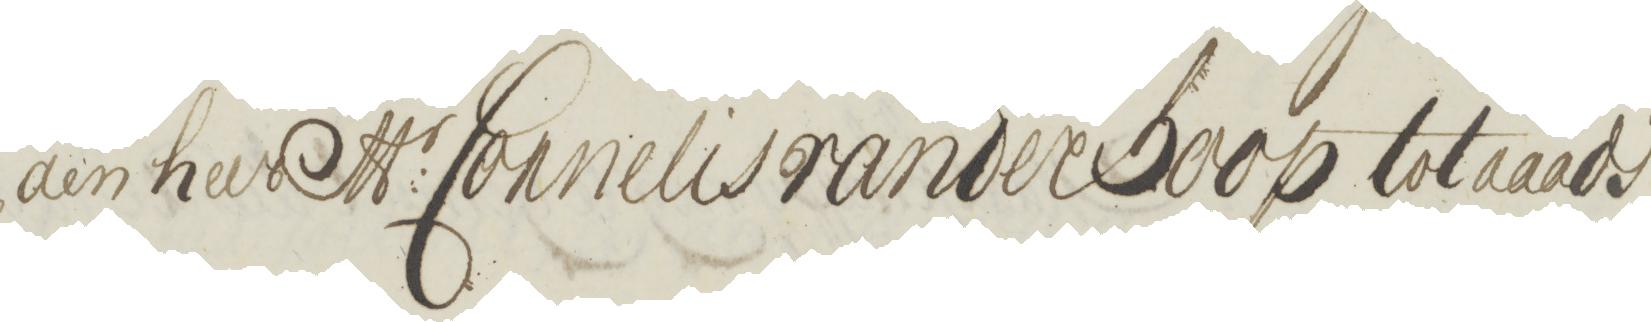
den heer M:r Cornelis van der Hoop tot raads
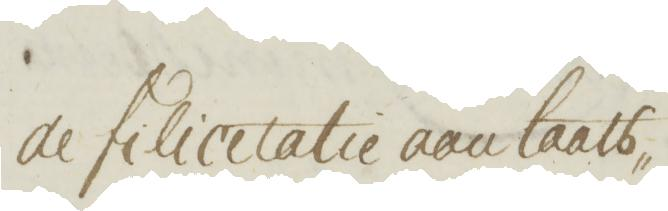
de filicetatie aan laats„
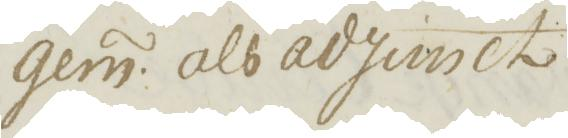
gem: als adjunct
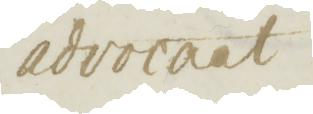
advocaat.
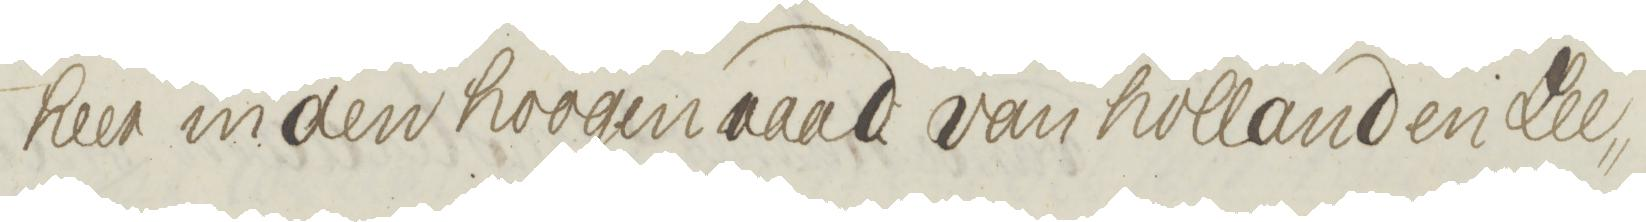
heer in den hoogen raad van holland en zee„
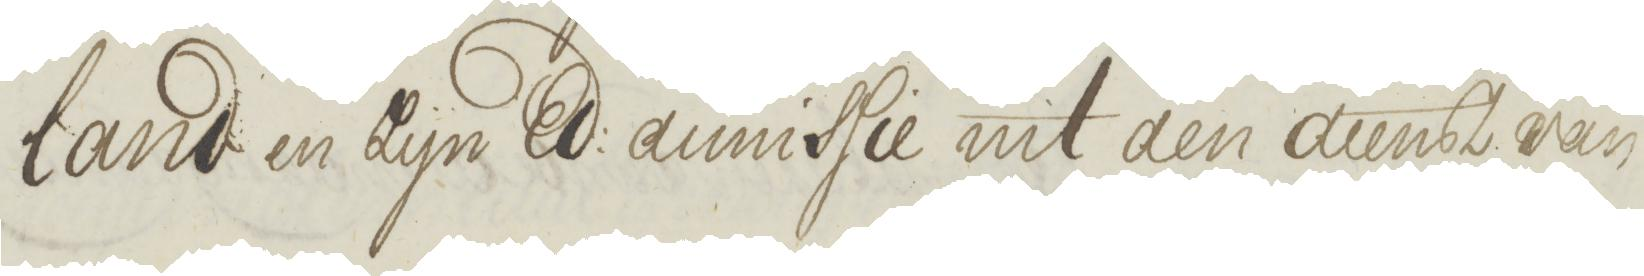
land en zijn Ed: dimissie uit den dienst van
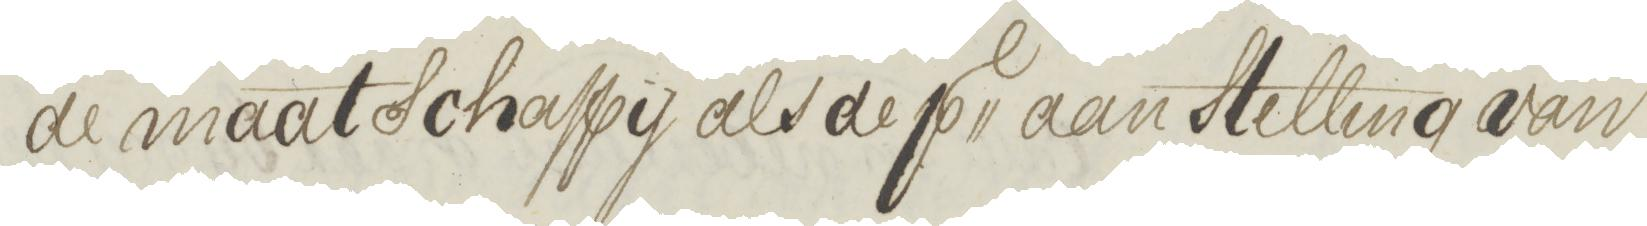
de maatschappij als de p„e aanstelling van
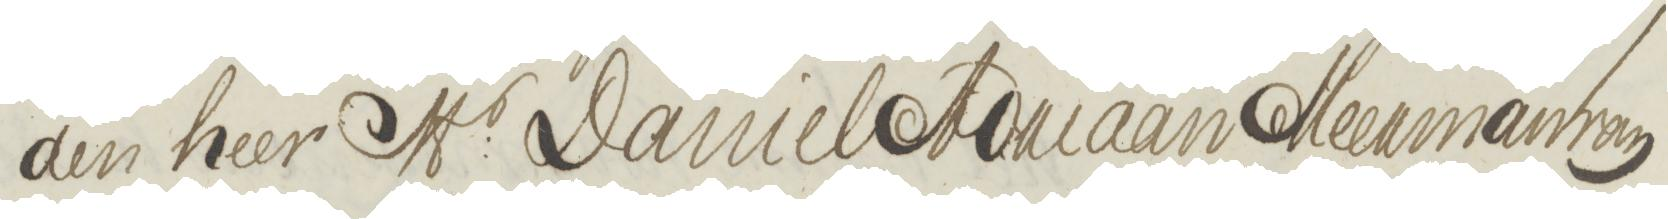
den heer M:r Daniel Adriaan Meerman van
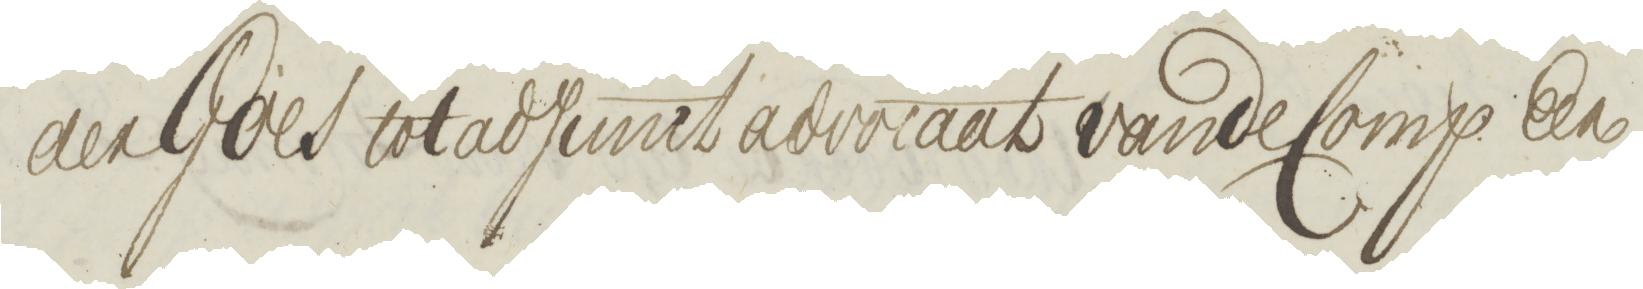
der Goes tot adjunct advocaat van de Comp: Eer
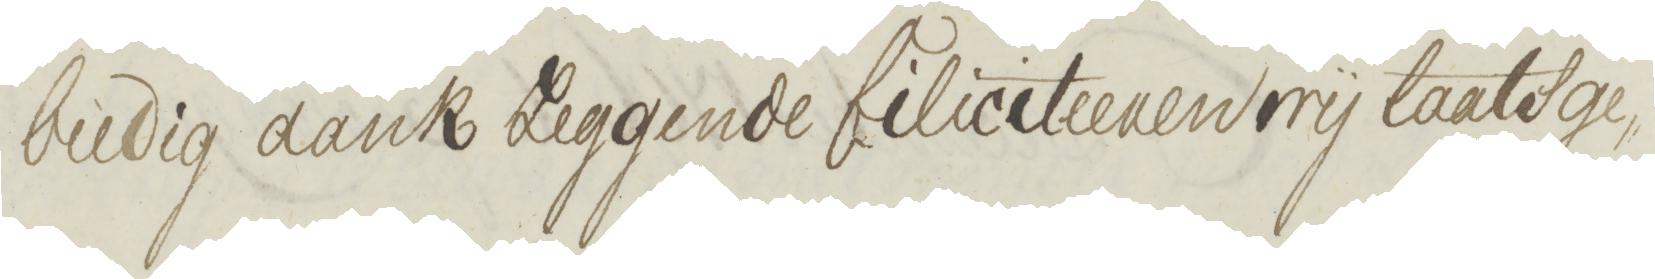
biedig dank zeggende filiciteeren wij laatsge„
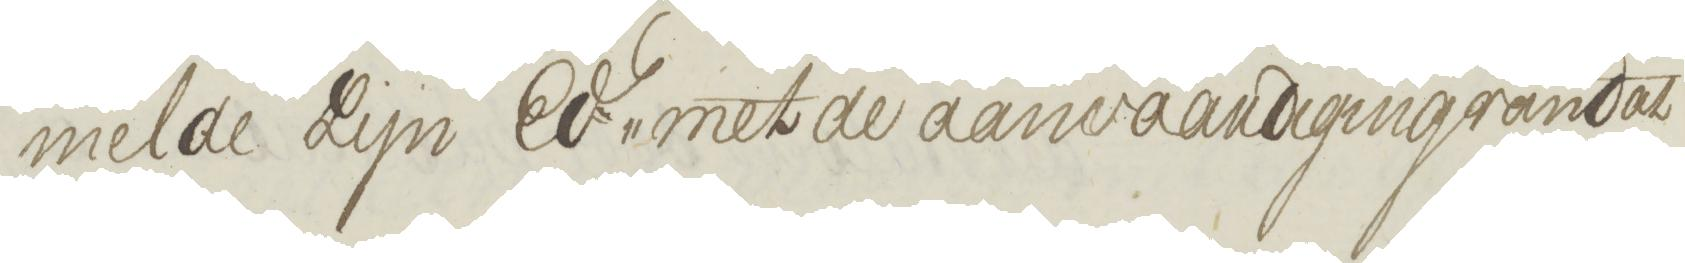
melde zijn Ed„e met de aanvaardiging van dat
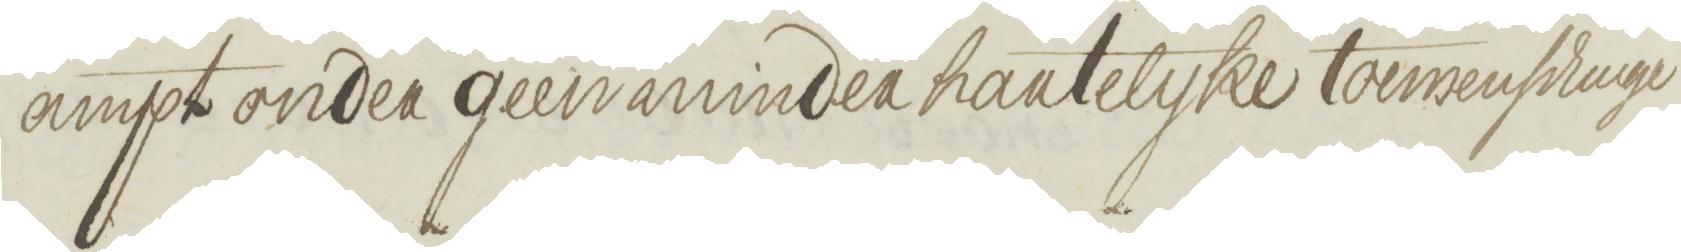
ampt onder geen minder hartelyke toewenschinge
